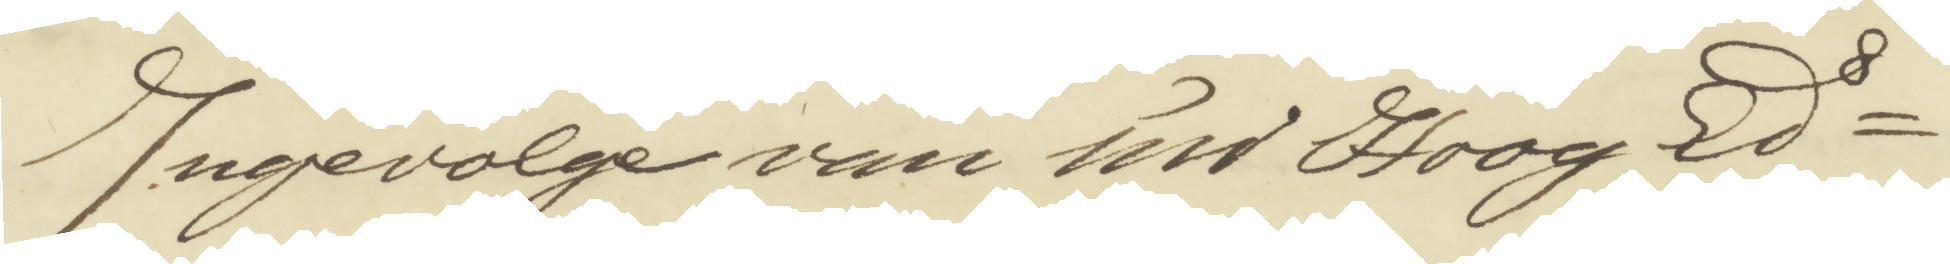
Jngevolge van uw Hoog Ed=s
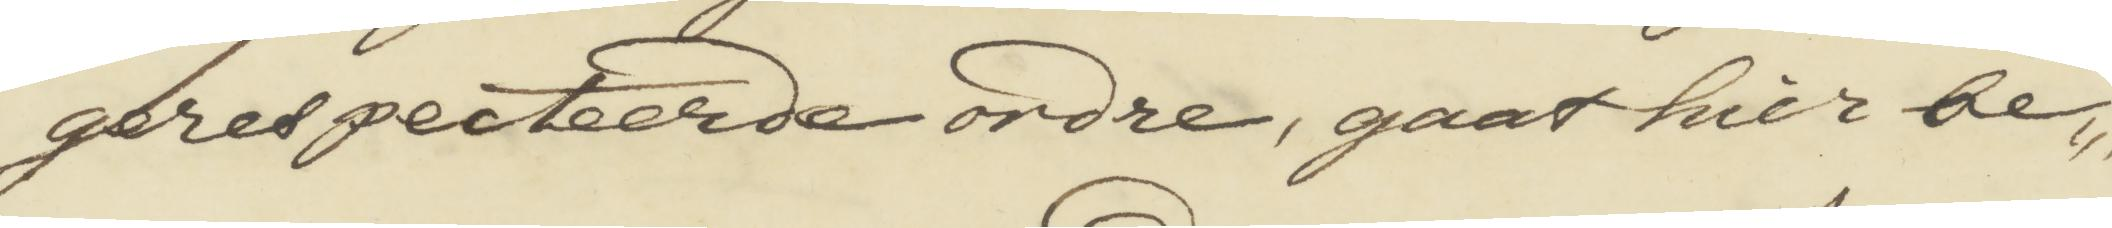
gerespecteerde ordre, gaat hier be„
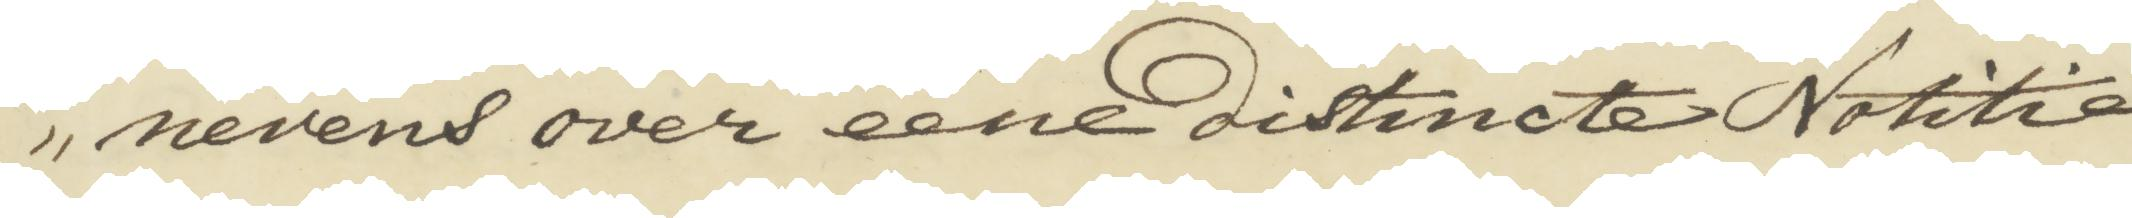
„nevens over eene distincte Notitie
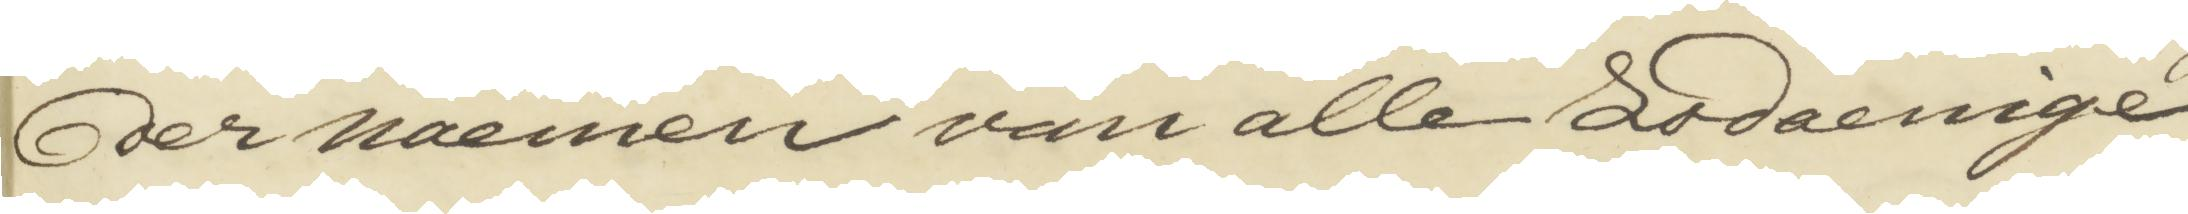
der naemen van alle Zodaenige
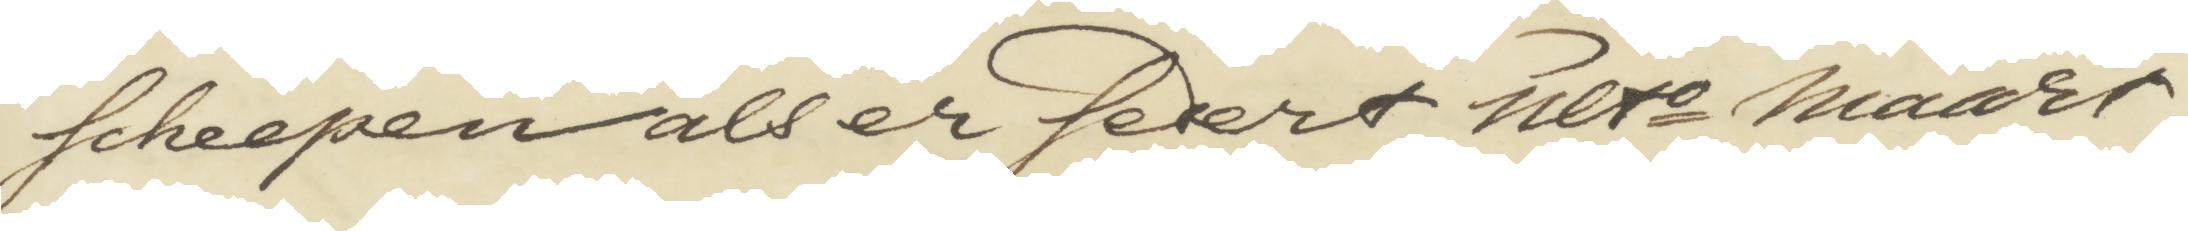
Scheepen als er sedert ult=o maart
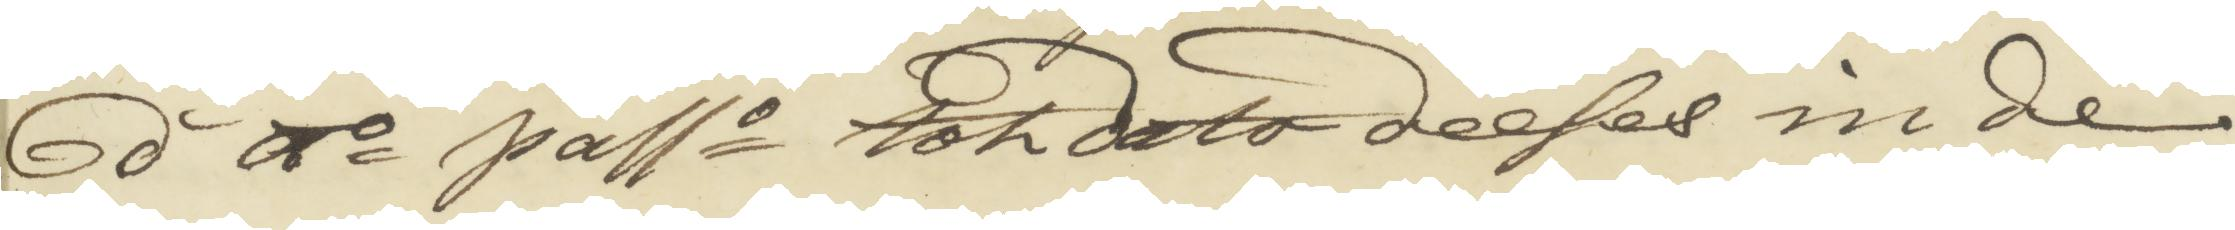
d’ A=o pass=o tot dato deeses in de
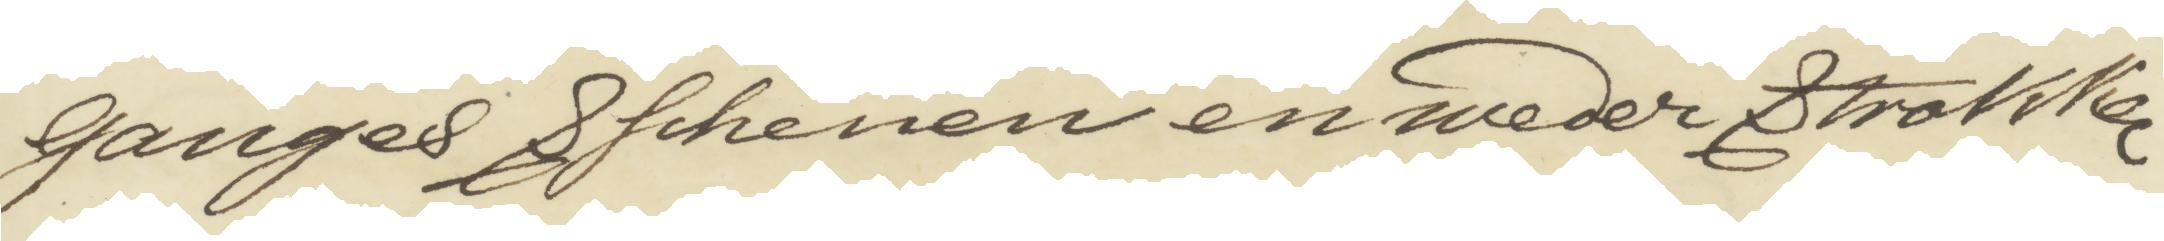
Ganges verschenen en weder vertrokken
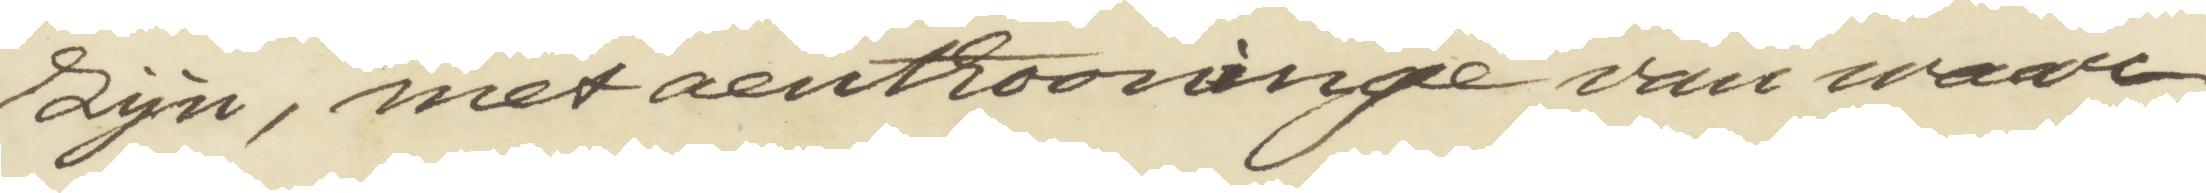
Zijn, met aenthooninge van waar
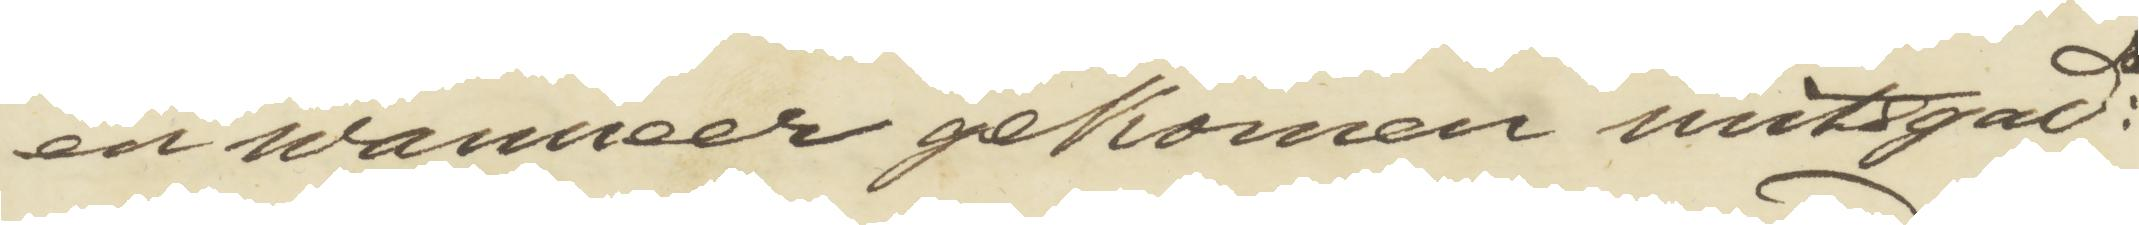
en wanneer gekomen mitsgad:s
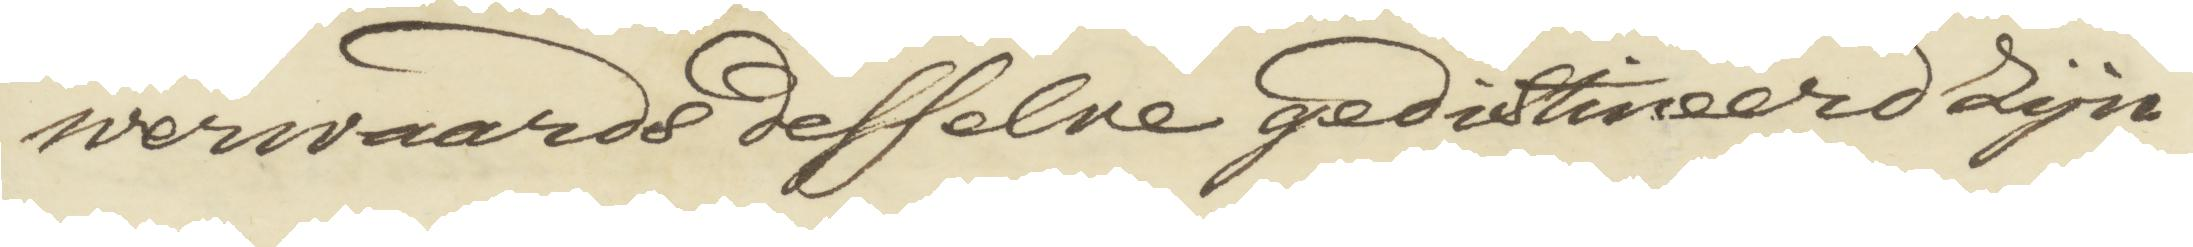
werwaards desselve gedistineerd Zijn
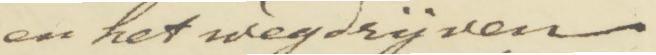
en het weg drijven
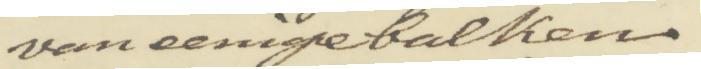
van eenige balken
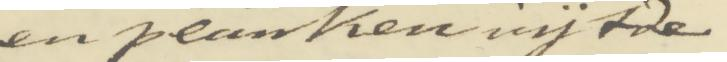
en planken uijt de
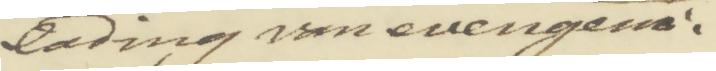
lading van evengem:
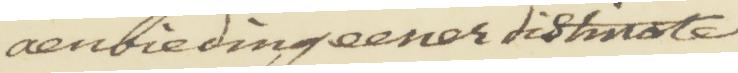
aenbieding eener distincte
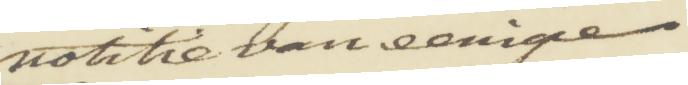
notitie van eenige
